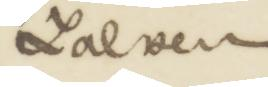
Zalven
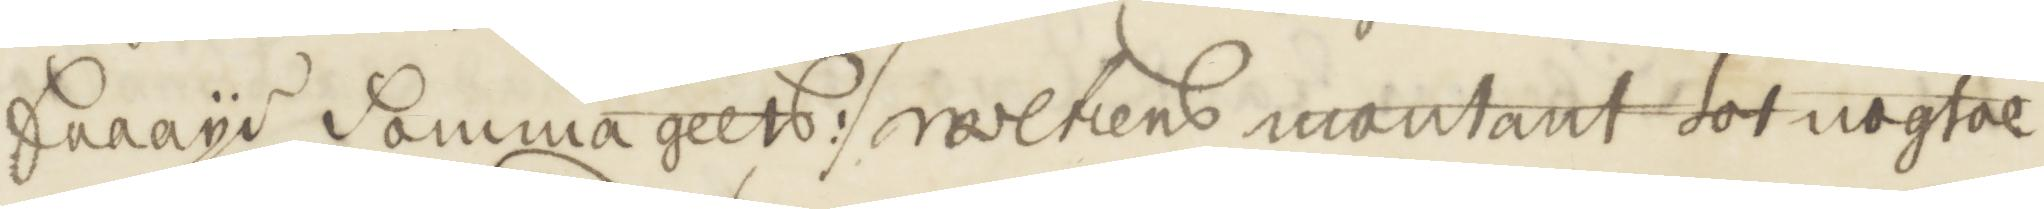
fraaije Somma gelts:/ welkers montant tot nogtoe
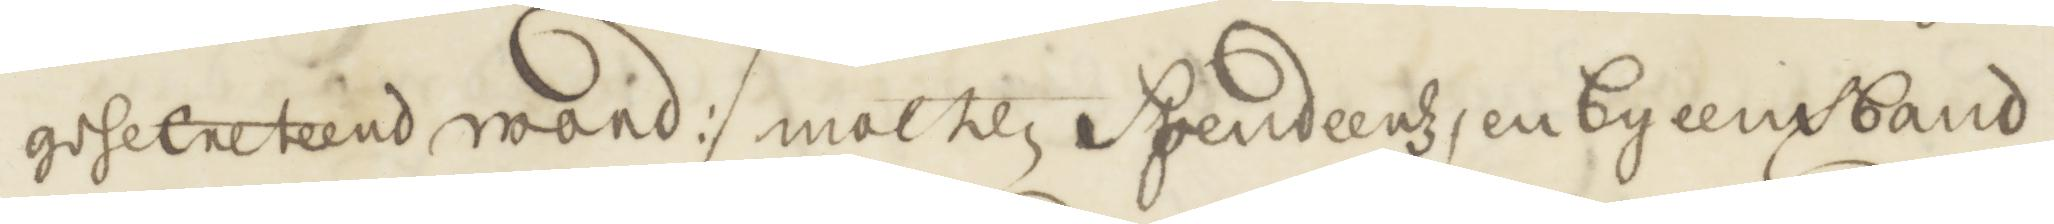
gesecreterd word :/ moeten spendeeren, en by een verband
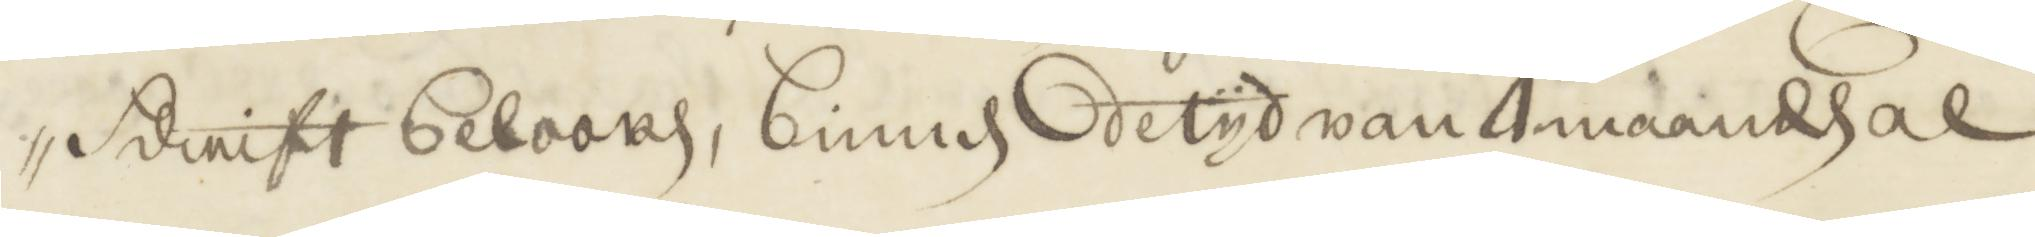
„schrift belooven, binnen de tijd van 4. maanden al
